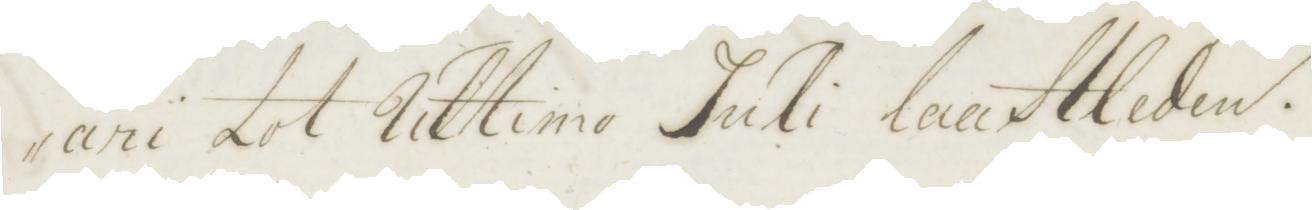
„ari tot Ultimo Iuli laastleden.
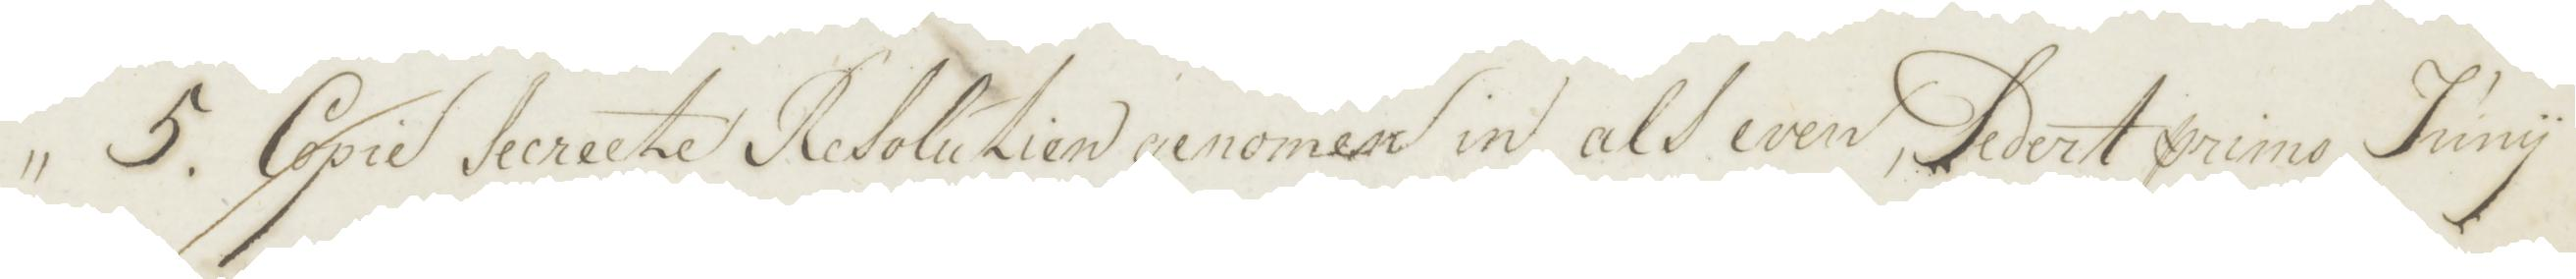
„ 5. Copie Secreete Resolutien genomen in als even, Sedert primo Iunij
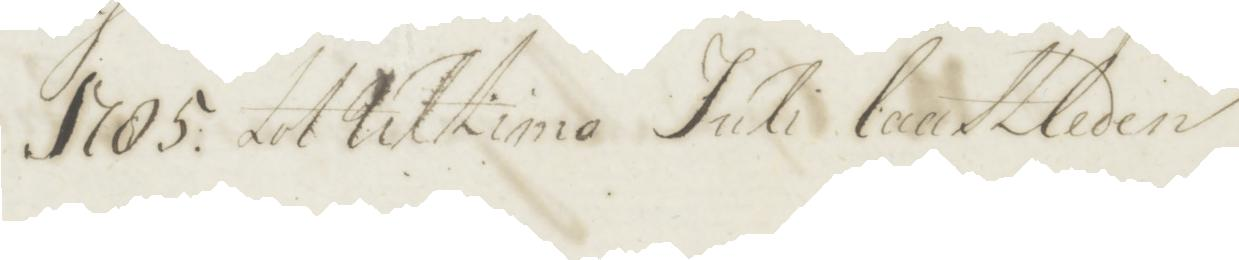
1785. tot Ultimo Iuli laastleden
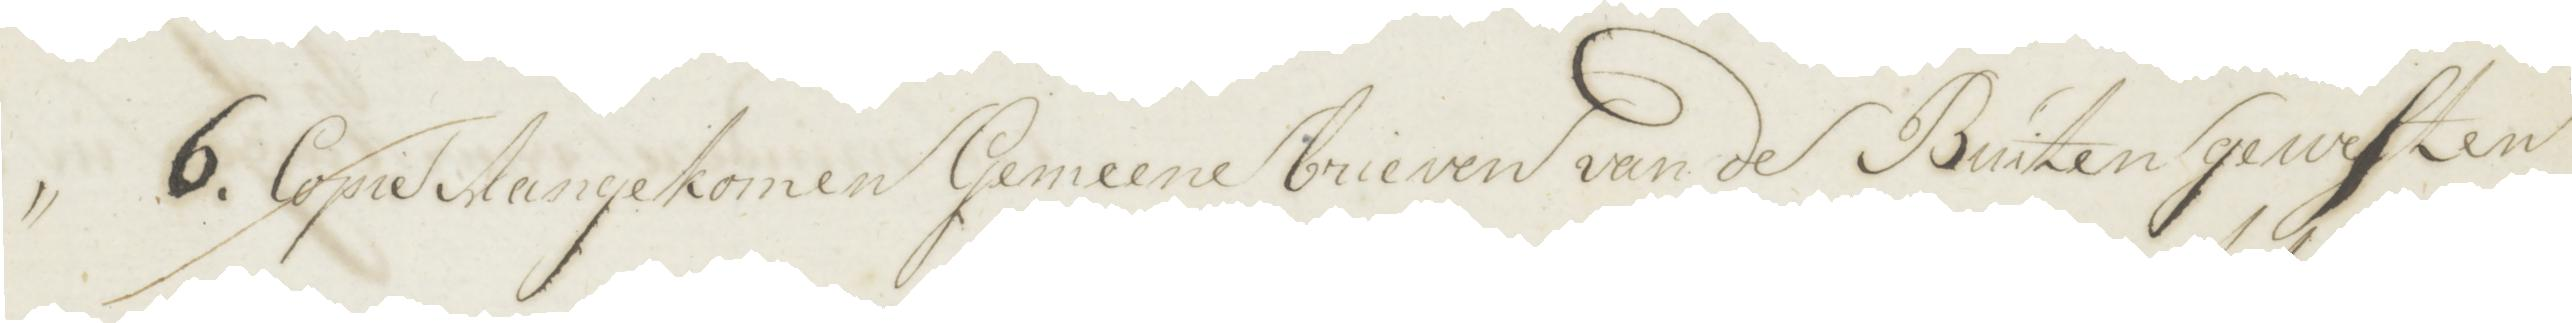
„ 6. Copie Aangekomen Gemeene brieven van de Buiten gewesten
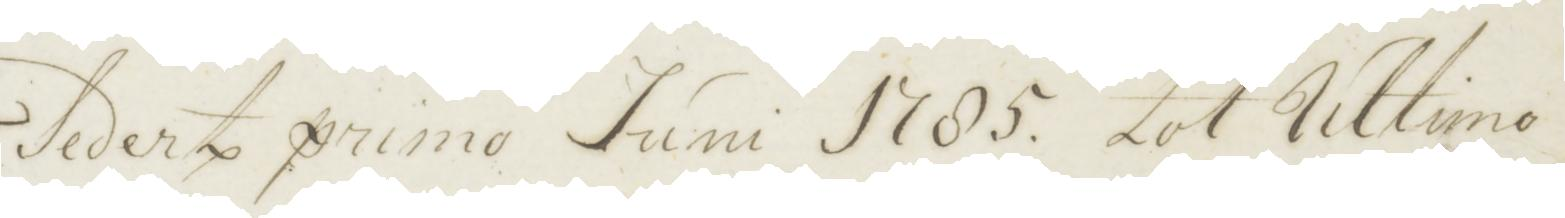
Sedert primo Iuni 1785. tot Ultimo
